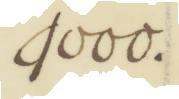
4000.
